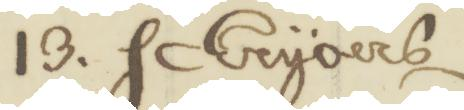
13. schrijvers
